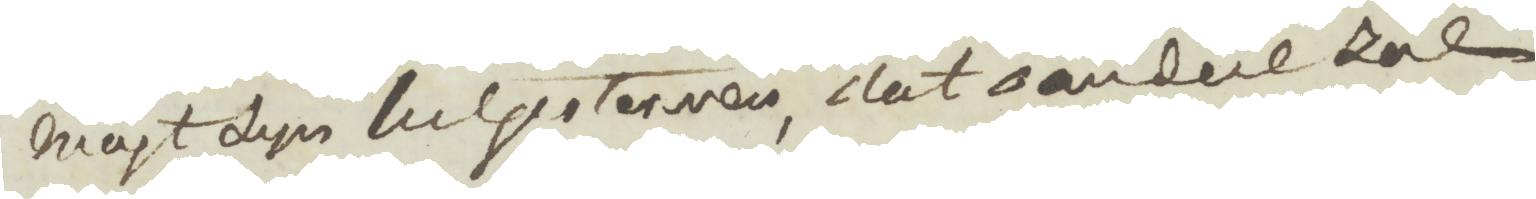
mogt zyn Megestorven, dat aandeel zal
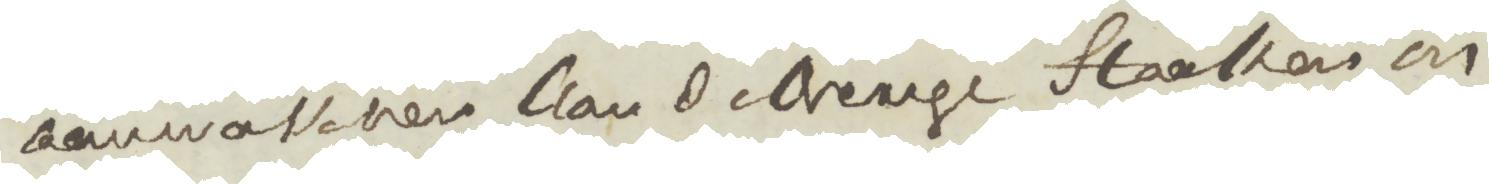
aanwasschen Aan de Overige staaken in
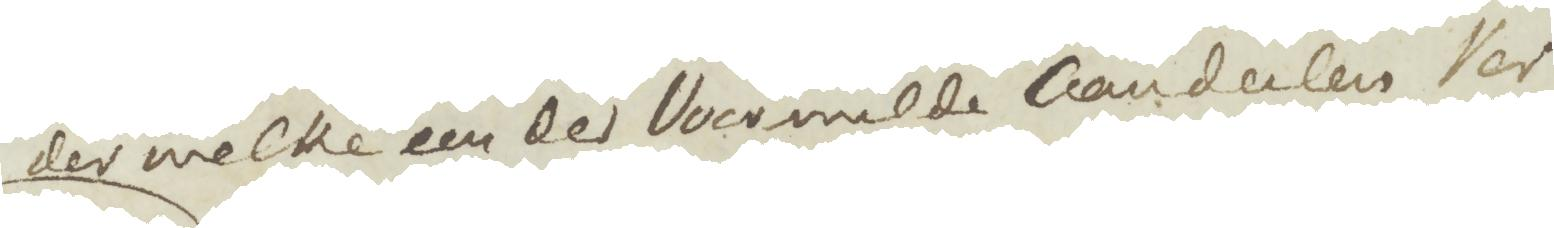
der welke een des Voormelde Aandeelen Ver
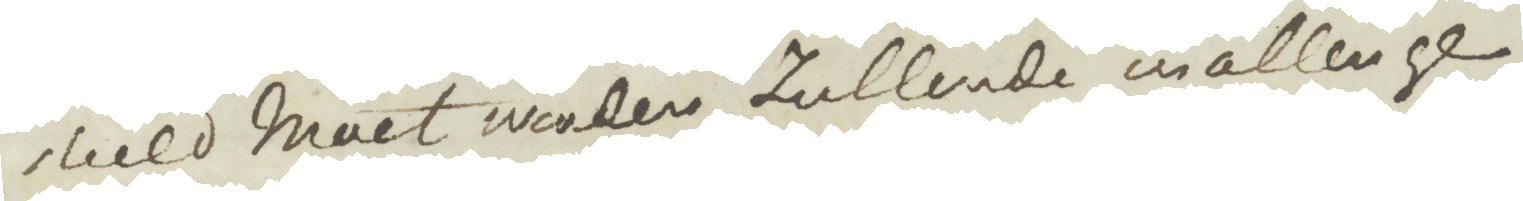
deeld moet worden zullende in allen ge
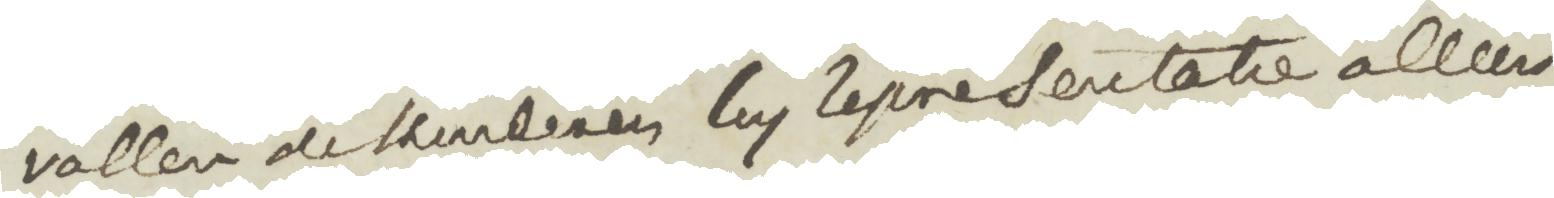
vallen de kinderen by representatie alleen
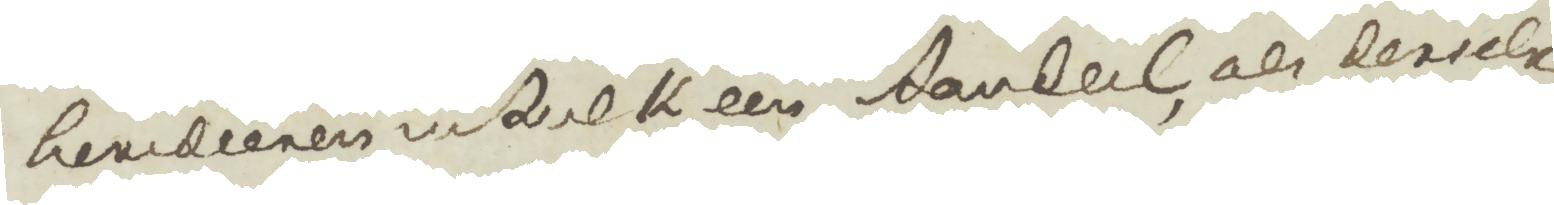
herideeren in zelk een Aandeel als derselve
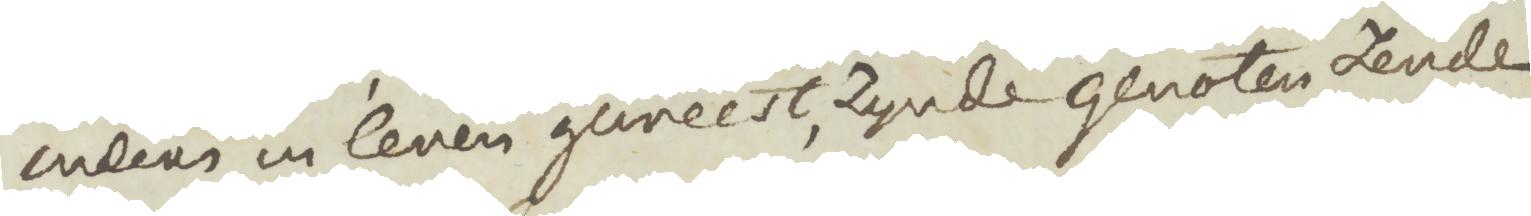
anders in Eenen geweest, zynde genoten zenden
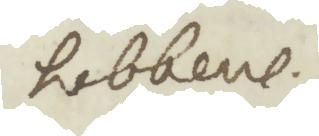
hebbend.
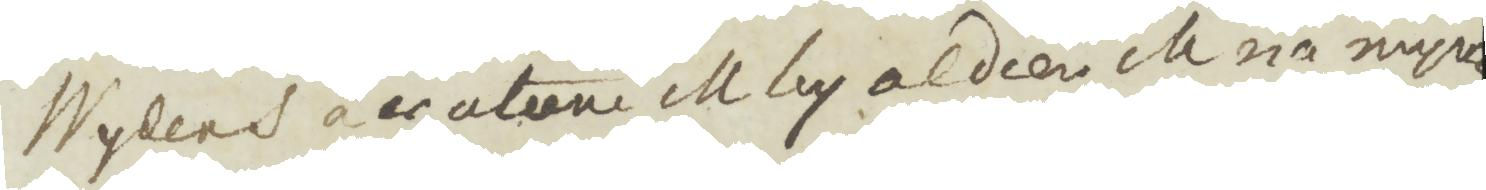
Wyders accateere ik by aldien ik na myn
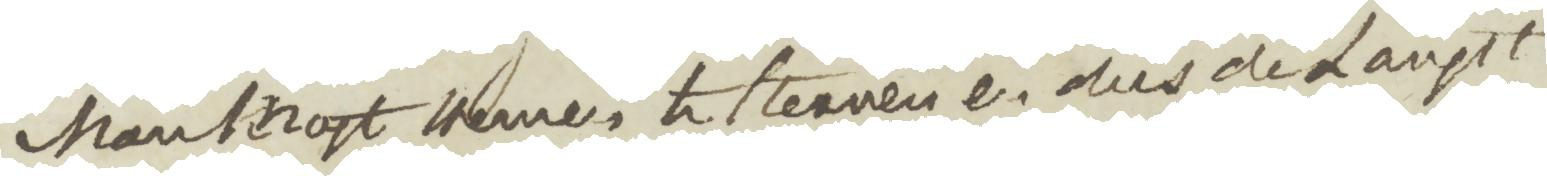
Man mogt komen te sterven, en dus de Langst
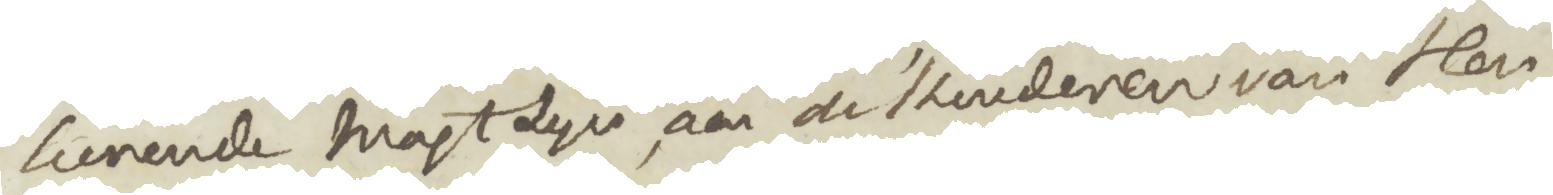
leevende mogt zyn, aan de kinderen van Hen
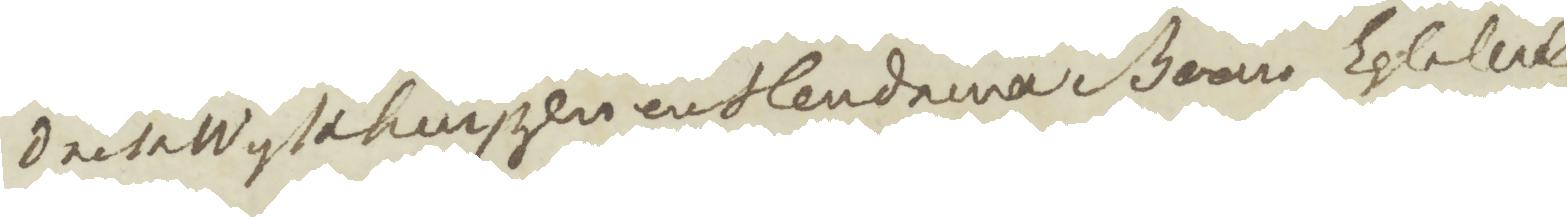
drik Wykhuyzen en Hendrina Boom Egblerd
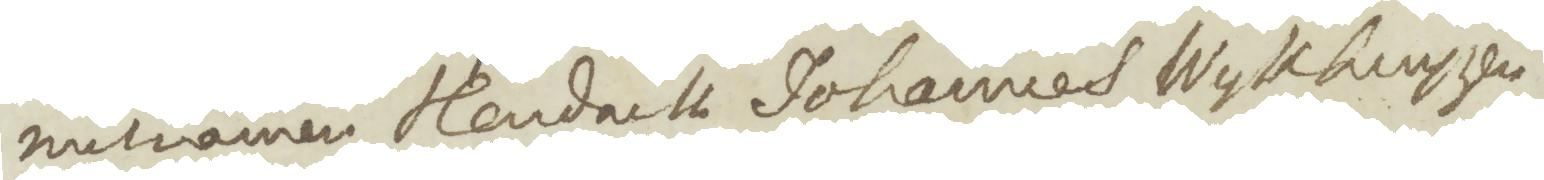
met namen Hendrik Johannes Wykhuyzen
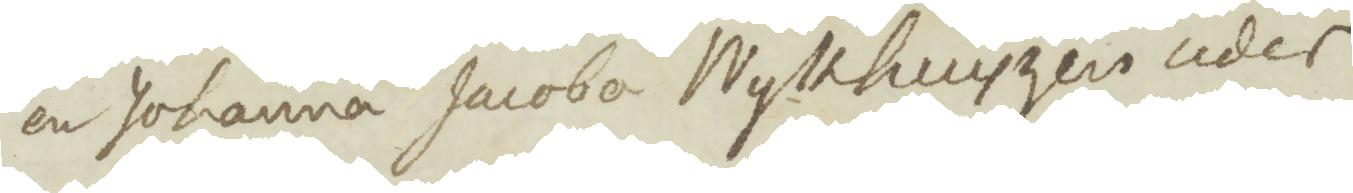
en Johanna Jacoba Wykhuyzen ieder
